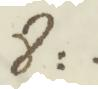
8:
